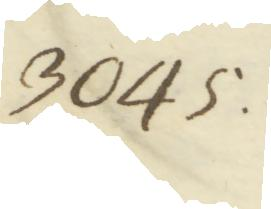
3045.
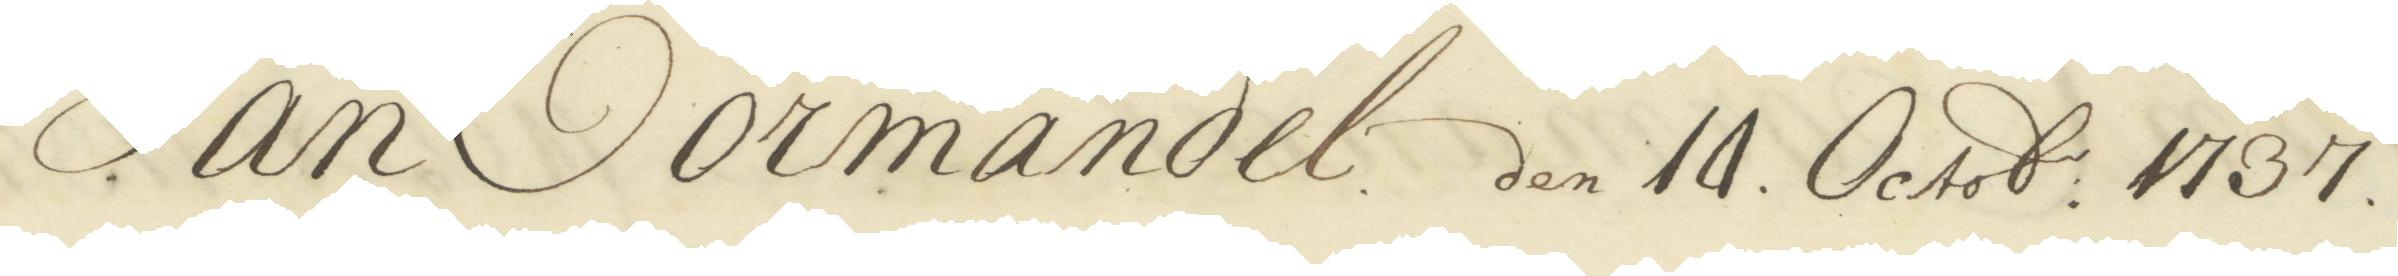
Van Cormandel den 14. Octob:r 1737.
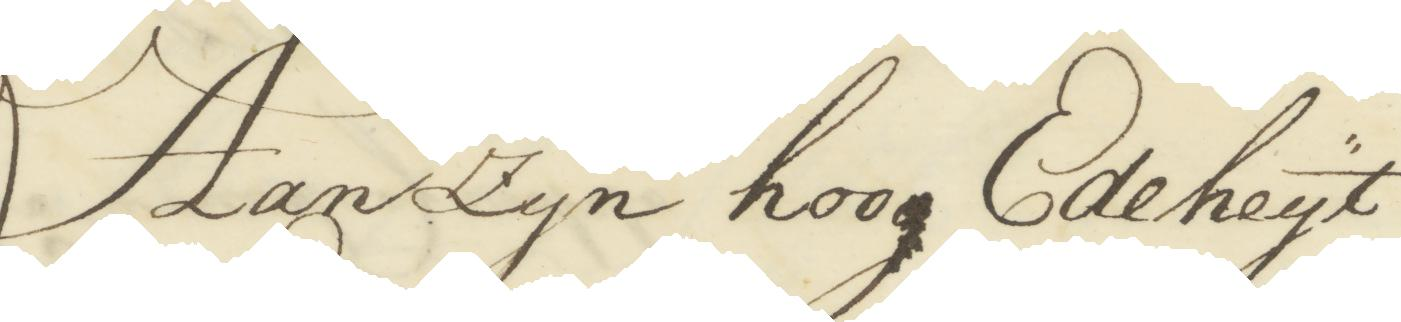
Aan zijn hoog Edeheijt
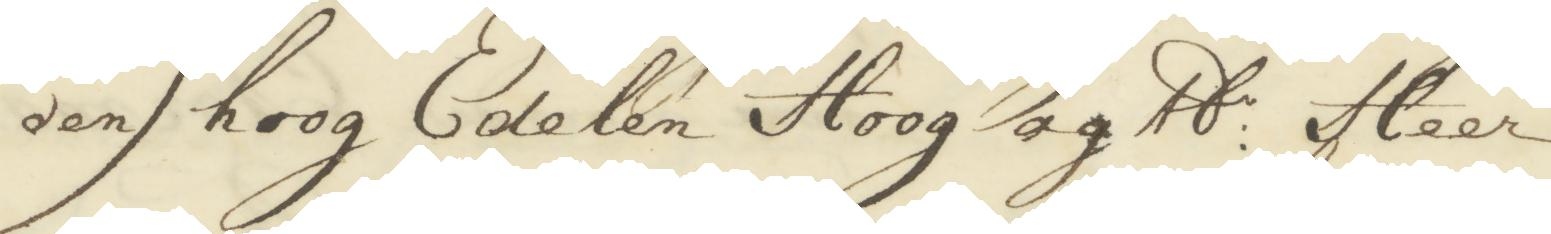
den hoog Edelen Hoog agtb: Heer
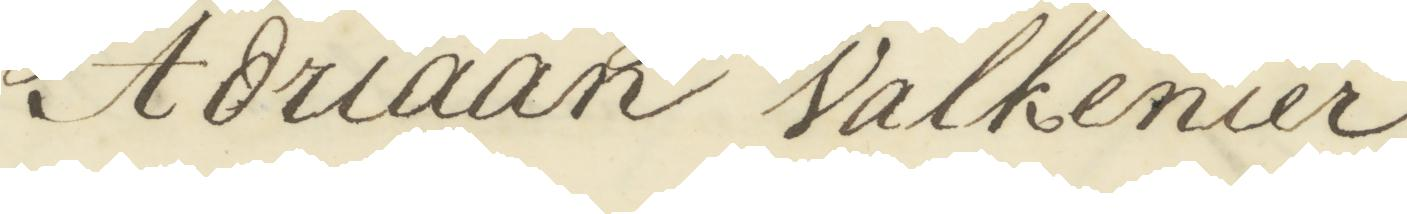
Adriaan Valkenier
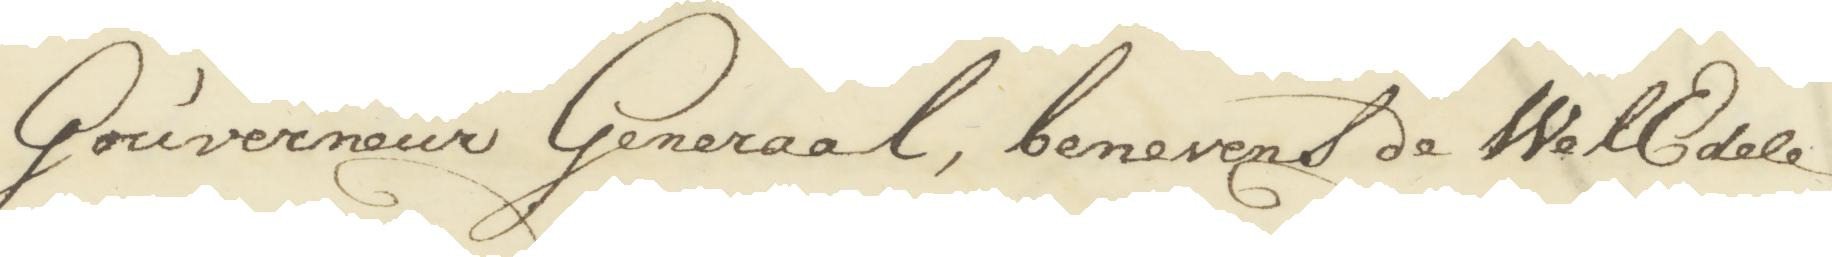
Gouverneur Generaal, benevens de Wel Edele
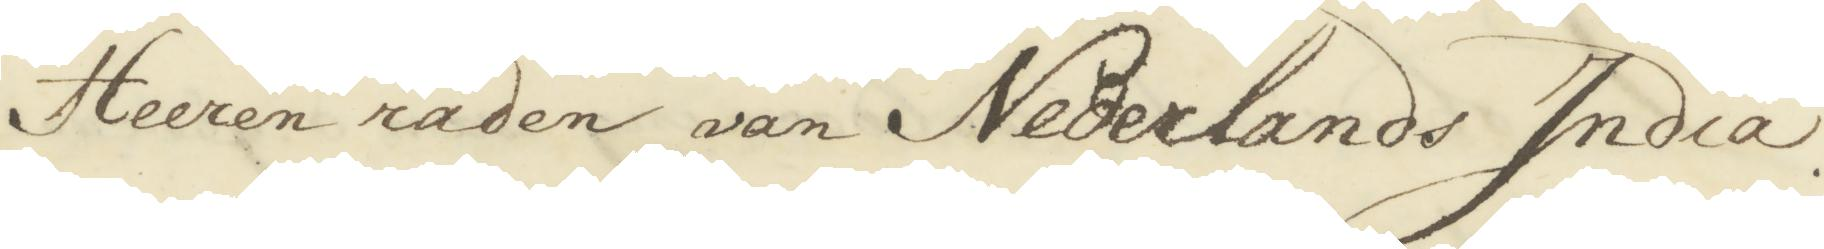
Heeren raden van Nederlands Jndia
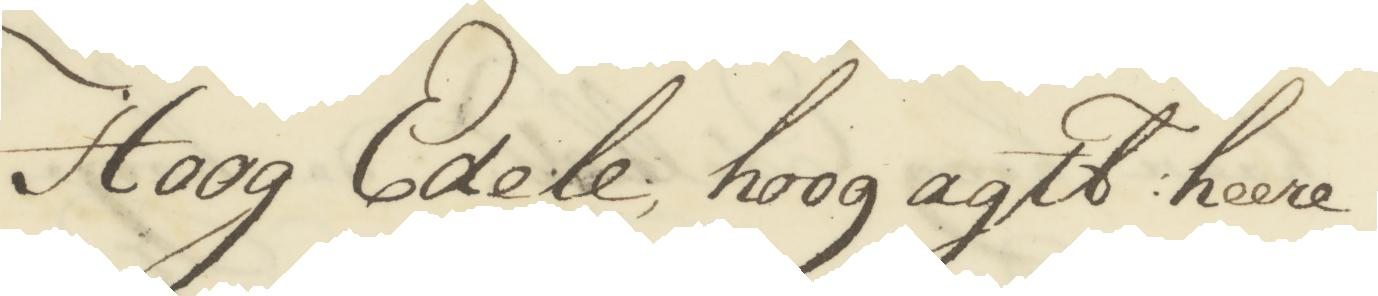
Hoog Edele, hoog agtb: heere
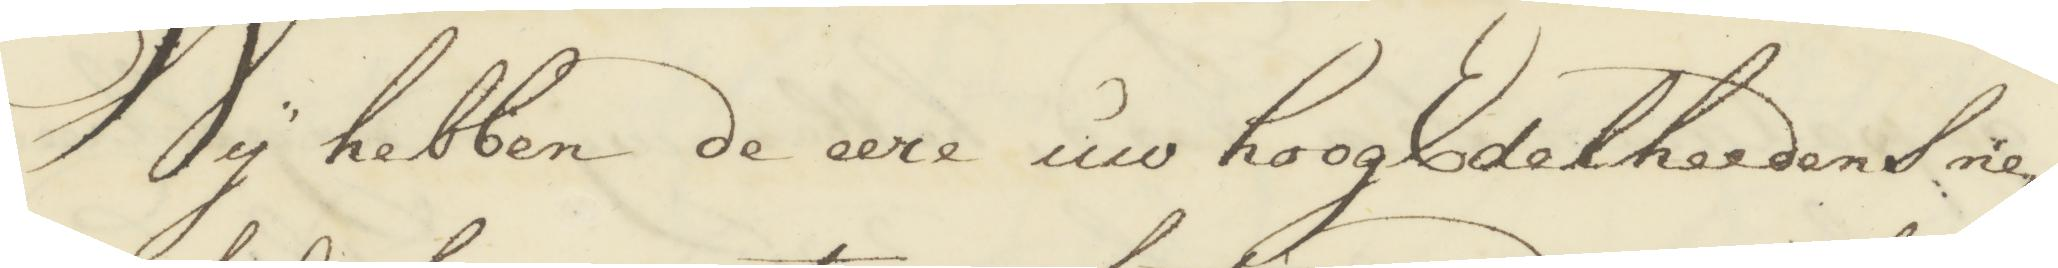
Wij hebben de eere uw hoog Edelheedens ne„
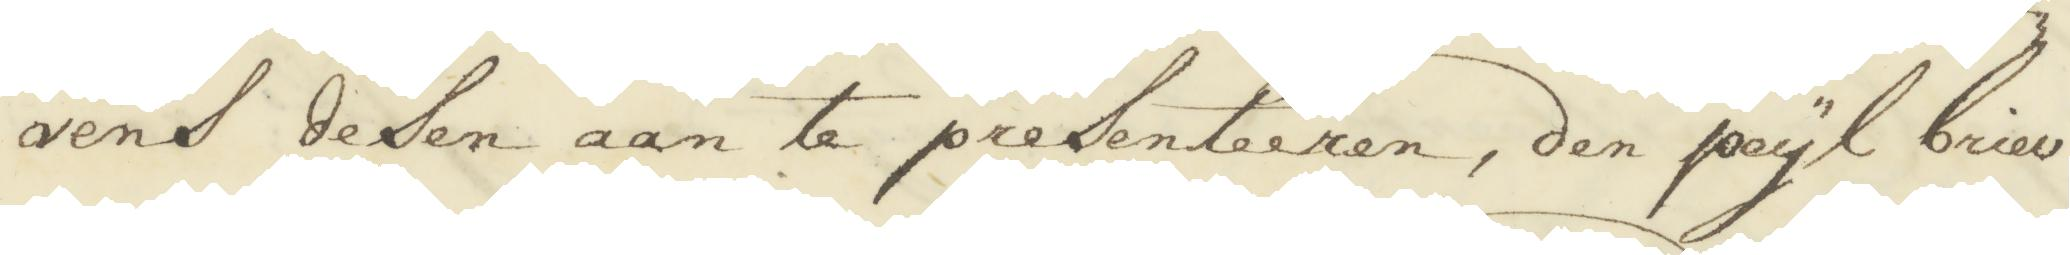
vens desen aan te presenteeren, den peijl briev
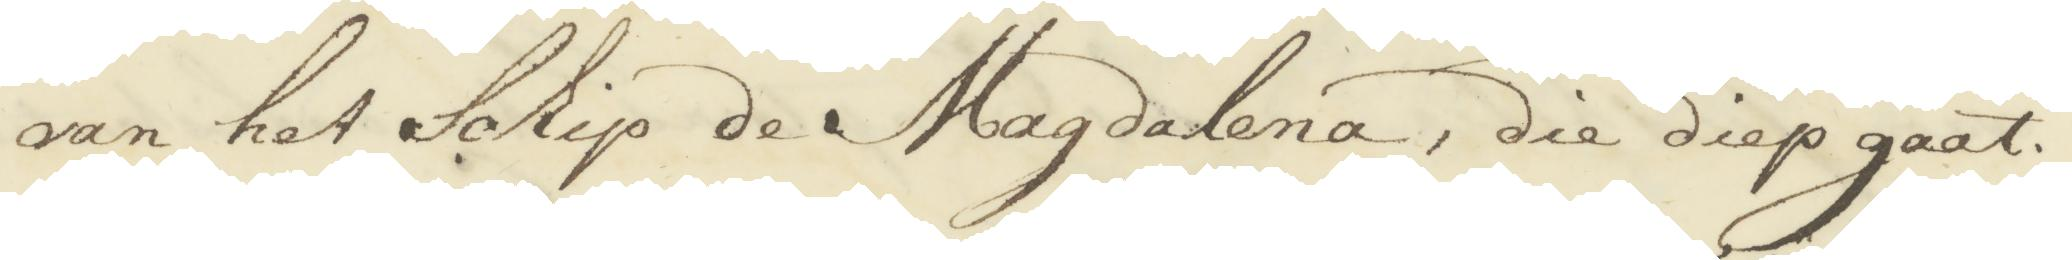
van het schip de Magdalena, die diep gaat.
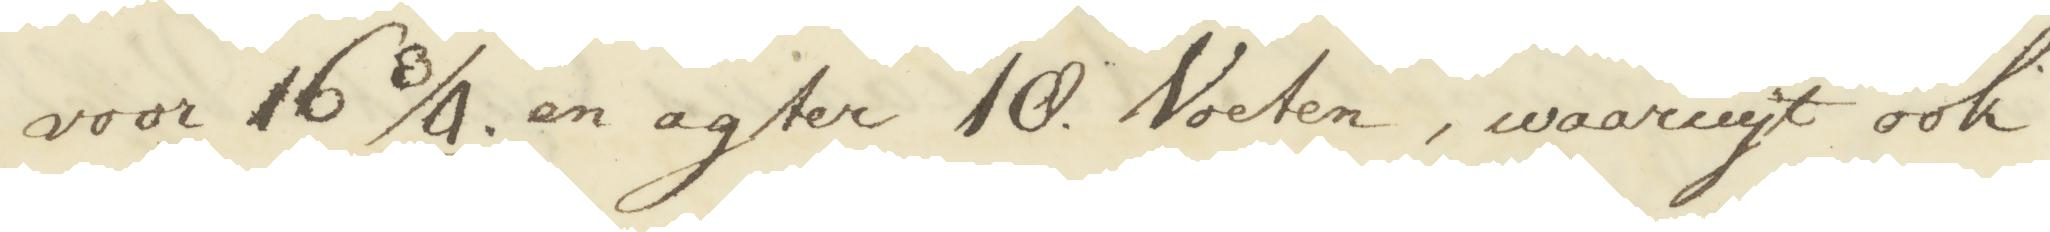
voor 16 3/4. en agter 18. Voeten, waaruijt ook
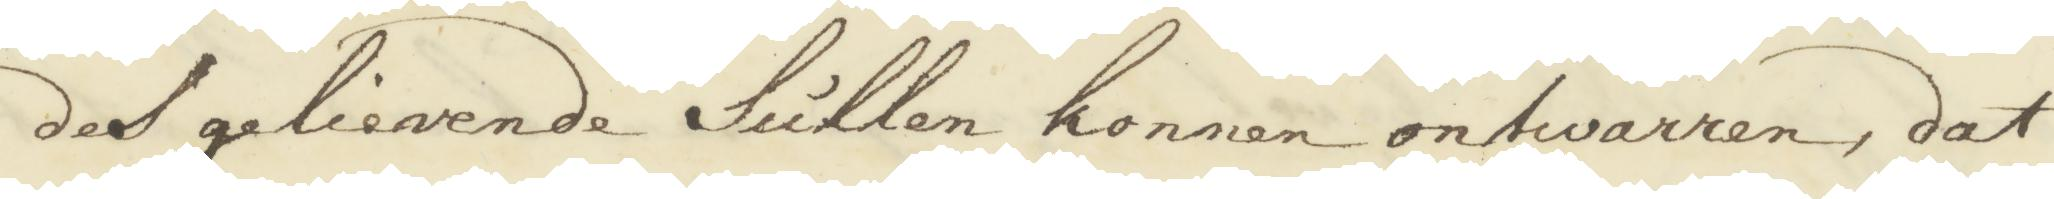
des gelievende sullen konnen ontwarren, dat
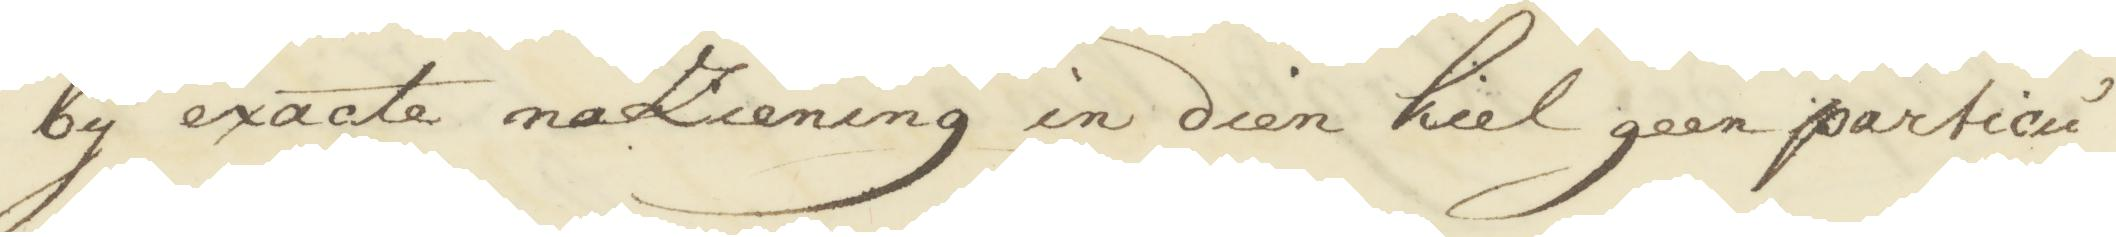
bij exacte naziening in dien kiel geen particu„
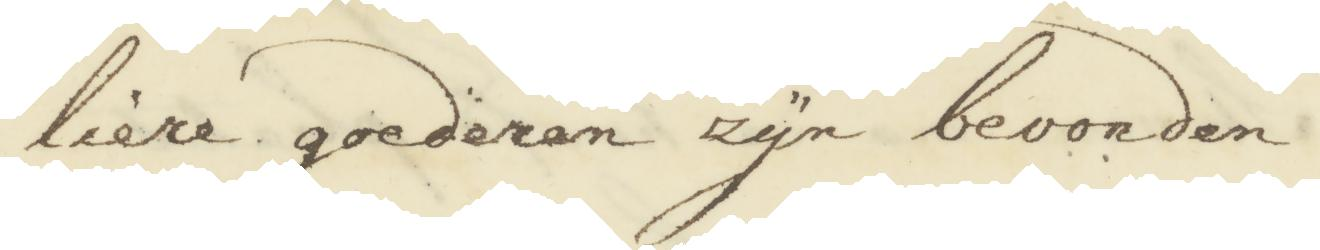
liere goederen zijn bevonden
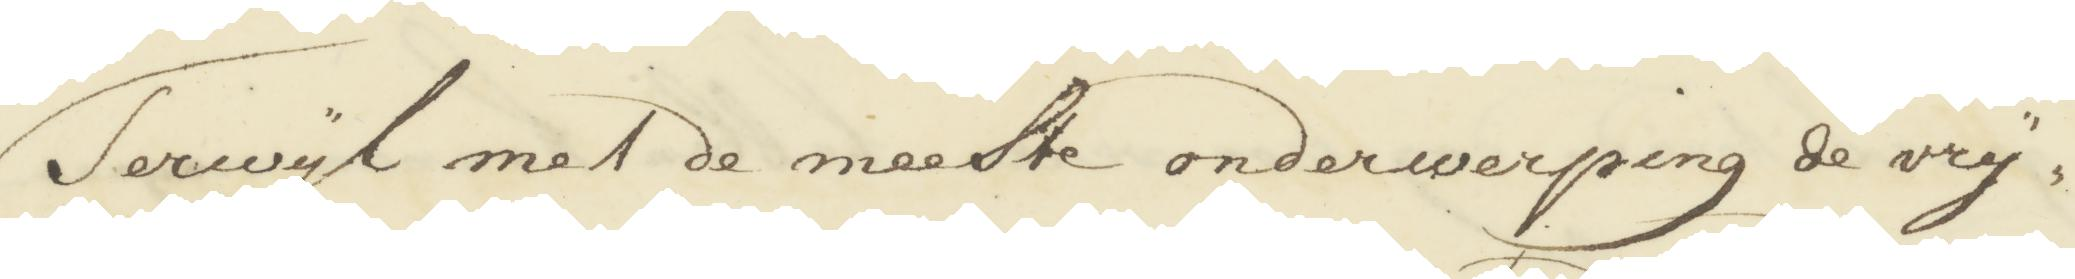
Terwijl met de meeste onderwerping de vrij„
